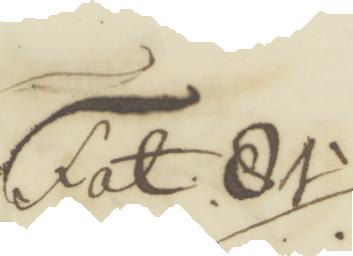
Fol 81
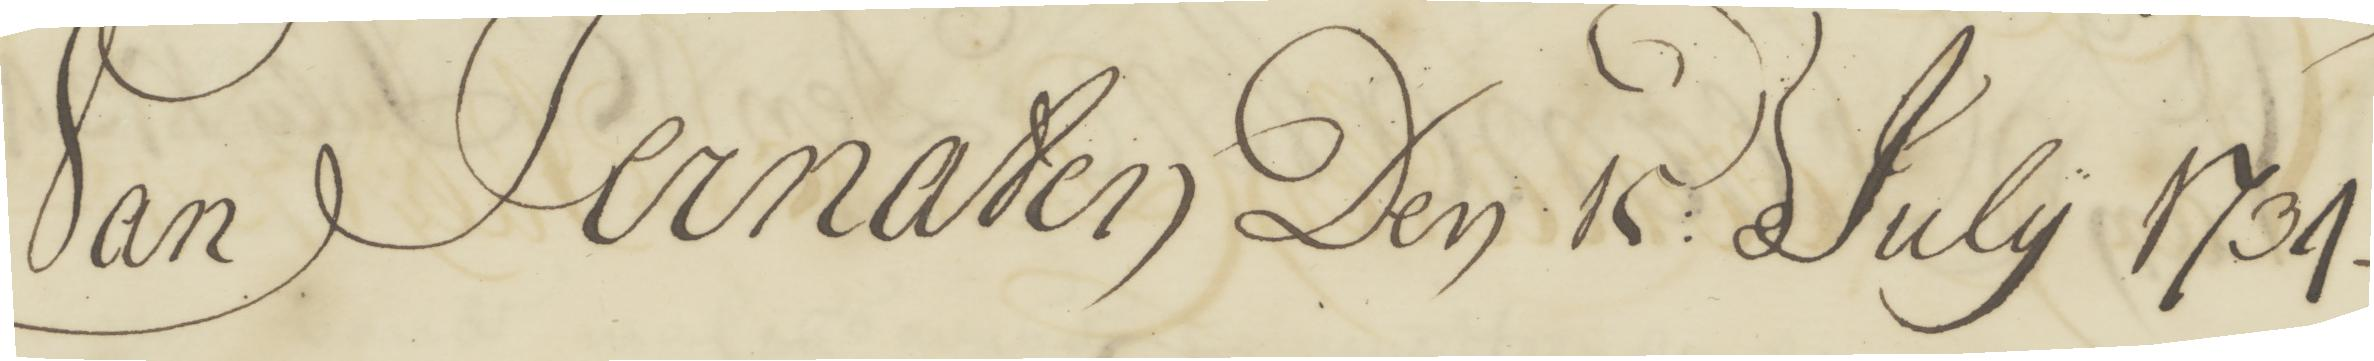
Van Ternaten Den 15:' Iulij 1734
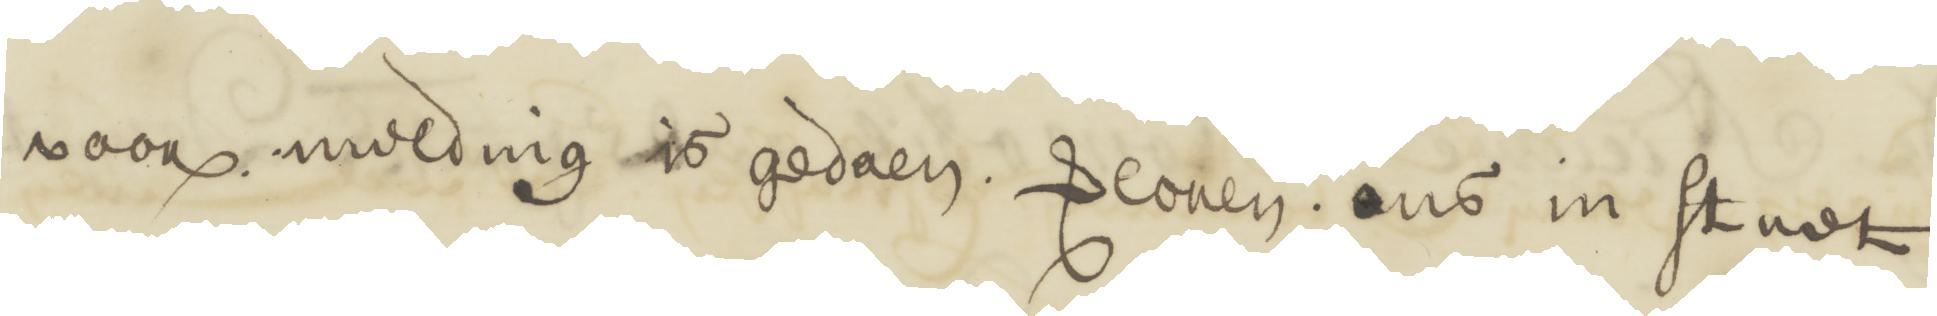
voor melding is gedaen verloren ons in staet
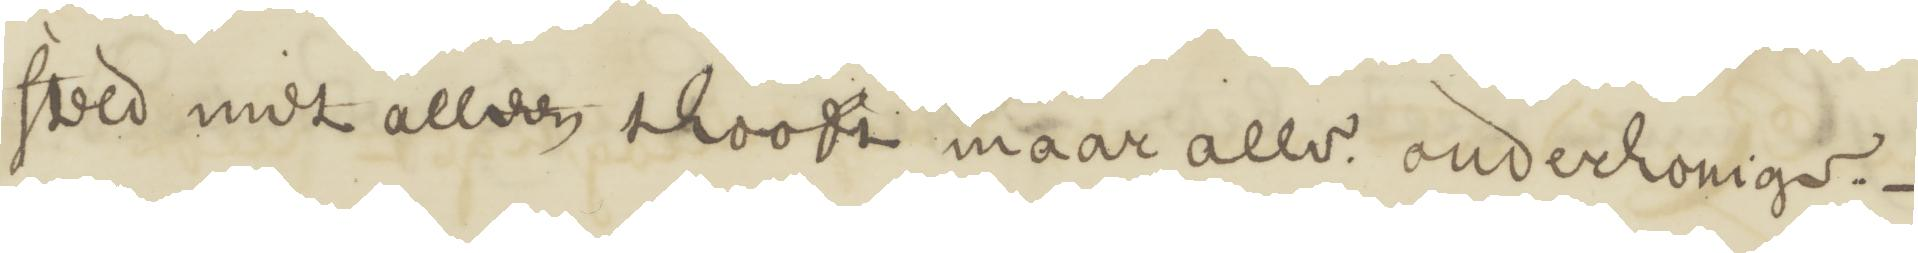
steld niet alleen thooft maar alle onderhorige.
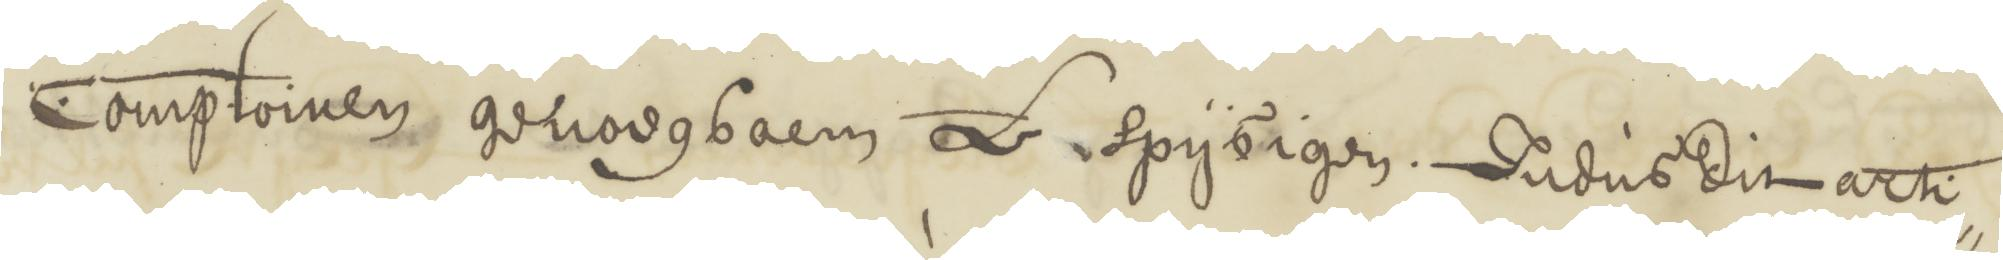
comptoiren genoegsaem te spijsigen. Endus dit arti„
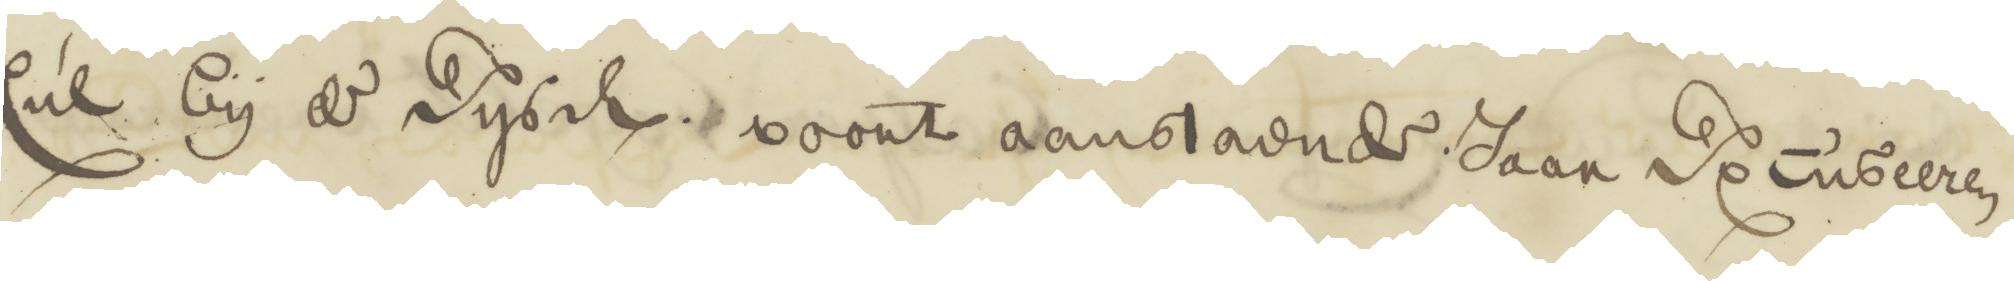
cul bij de Eijsch voor 't aanstaende Iaar Excuseeren
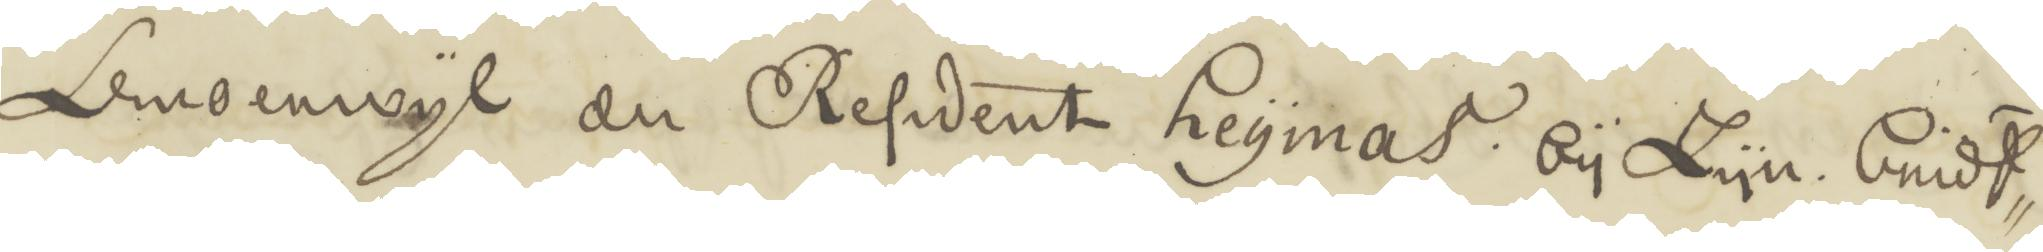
temo erwijl den Resident heijmas bij zijn brief„
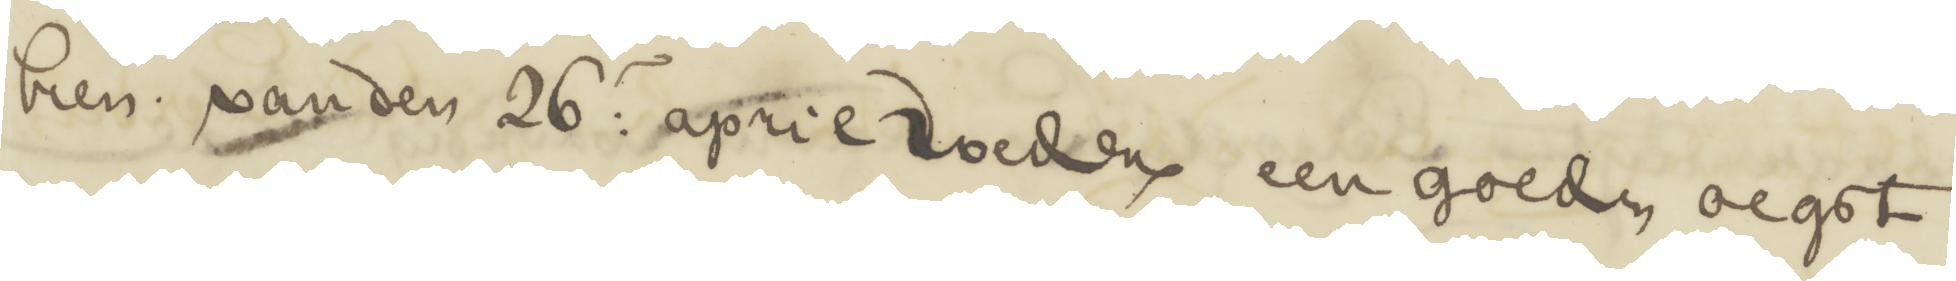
ken van den 26:' april weder een goeden oegst
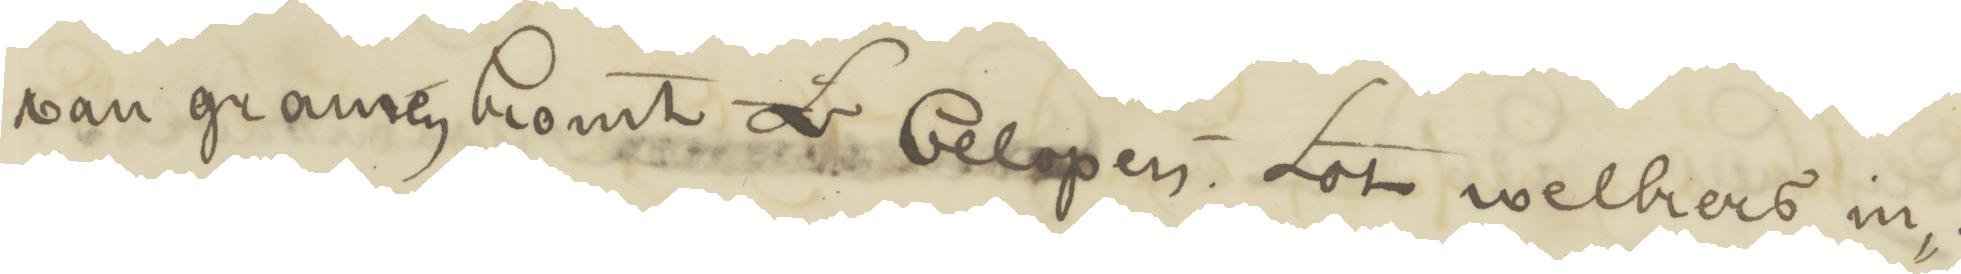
van granen komt te belopen tot welkers in„
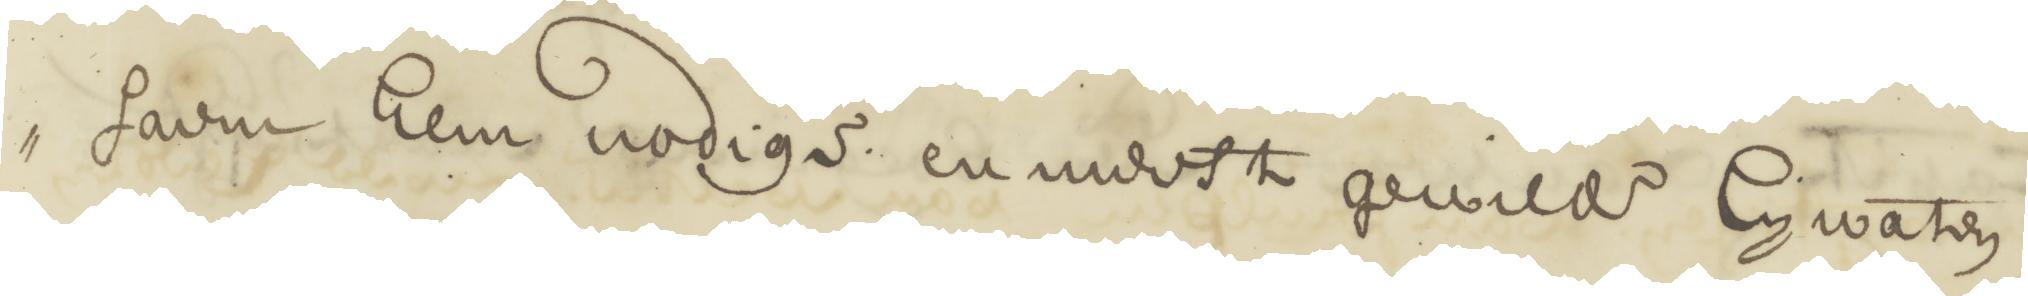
„saem hem nodige en meest gewilde lijwaten
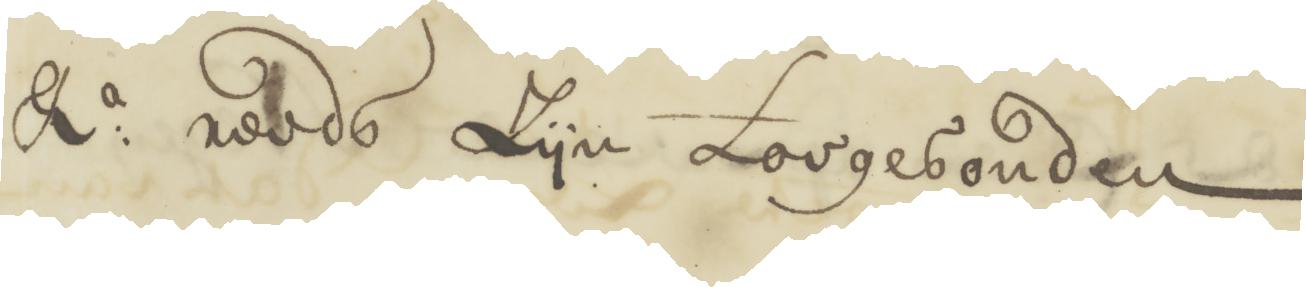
&:a reeds zijn toegesonden
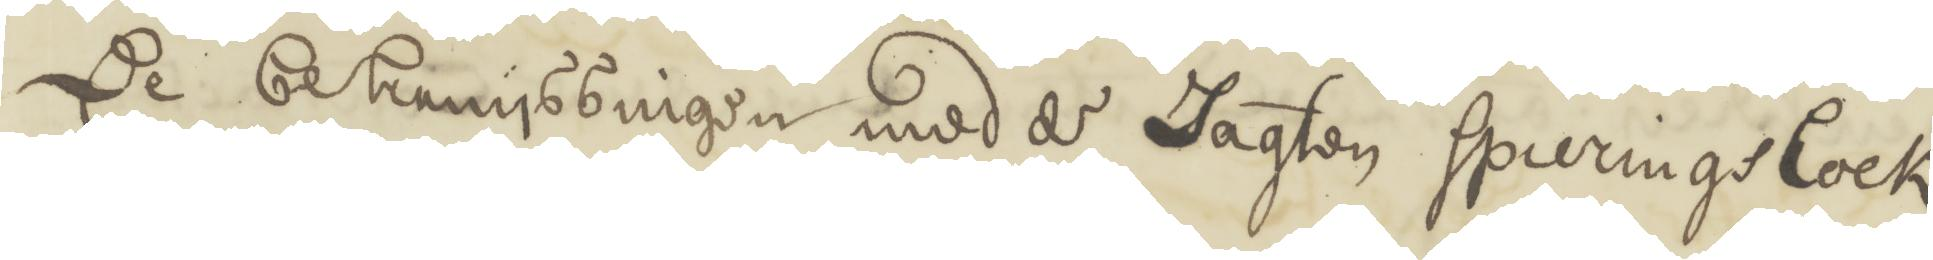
De bekruijssingen med de Iagten spieringshoek
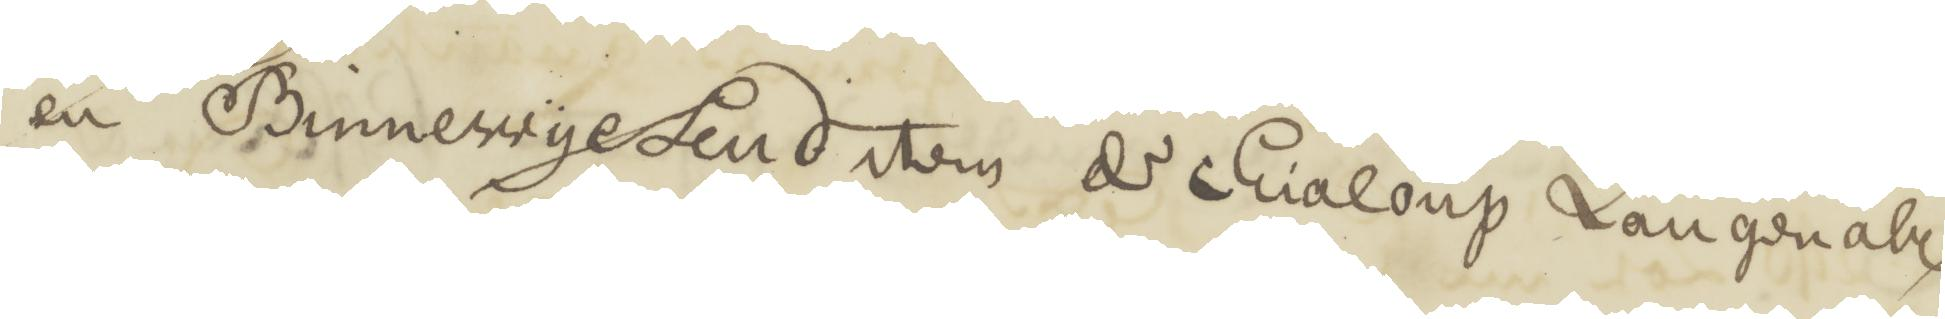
en Binnewijesend item de Chialoup Langerak
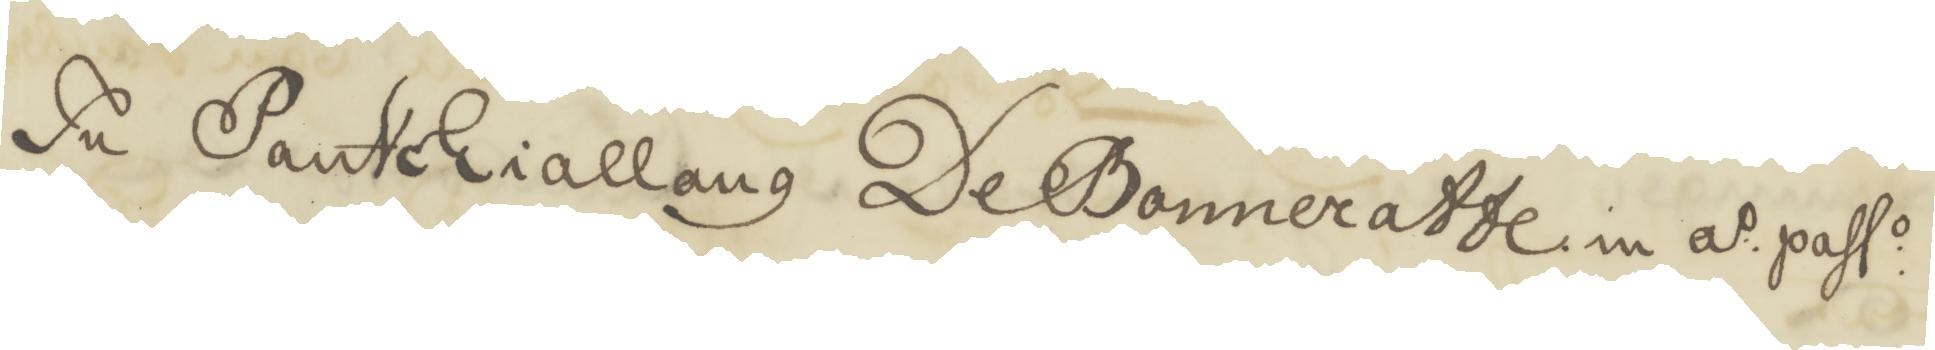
En Pantchiallang De Bonneraffe in a:o pass:o
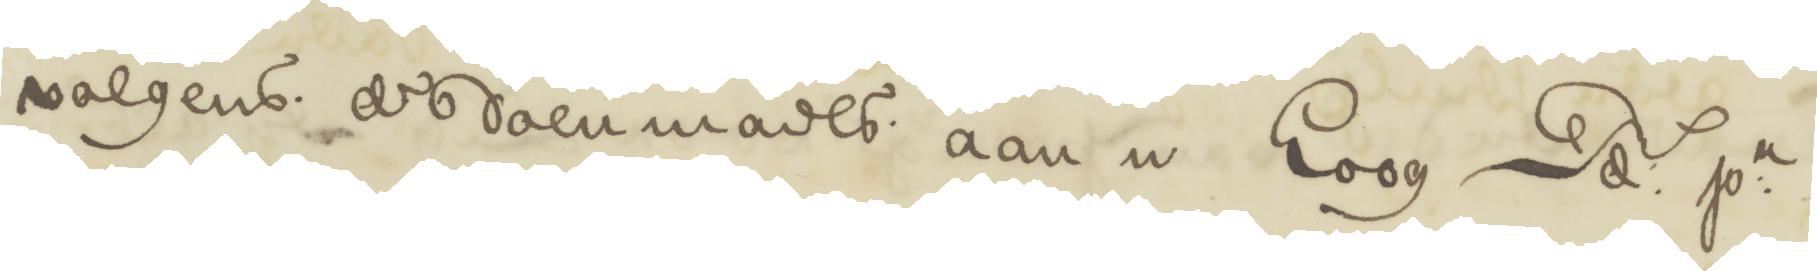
volgens de doen maels aan u hoog Ed:s p:r
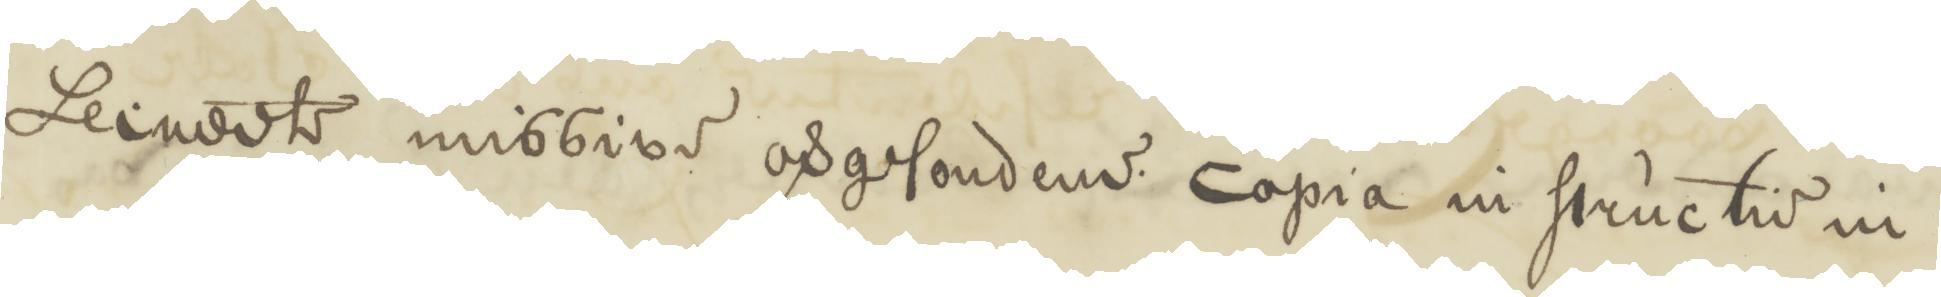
secreete missive overgesondene copia in structie in
